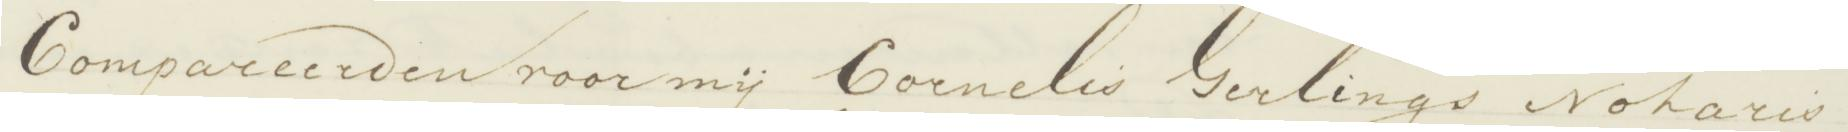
Compareerden voor mij Cornelis Gerlings Notaris
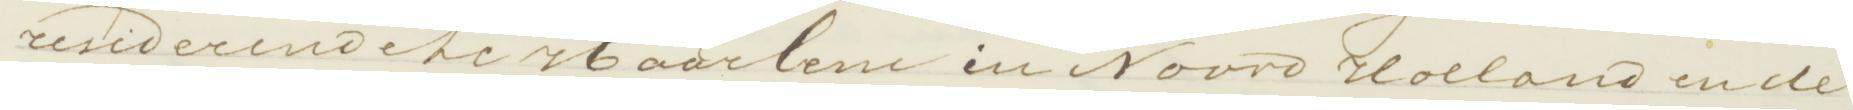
residerende te Haarlem in Noord Holland en de
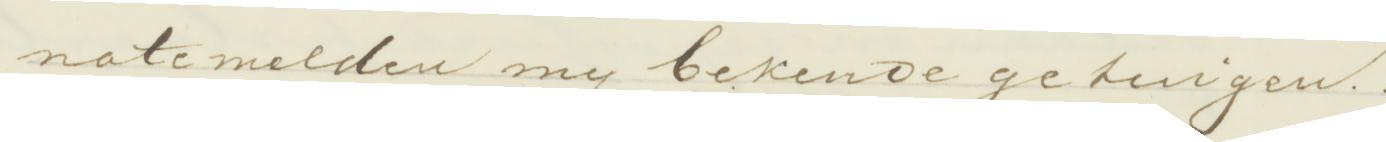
nate melden my bekende getuigen.
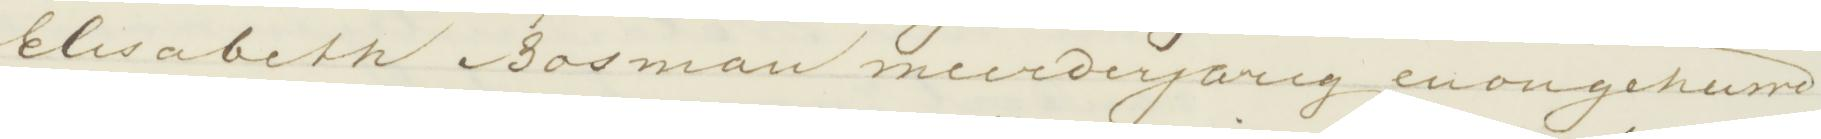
Elisabeth Bosman meerderjarig en ongehuwd
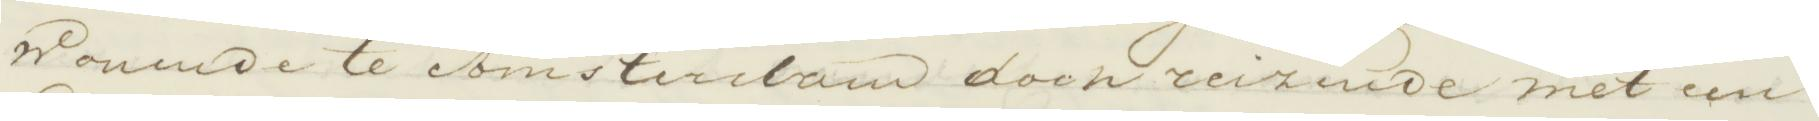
wonende te Amsterdam doch reizende met een
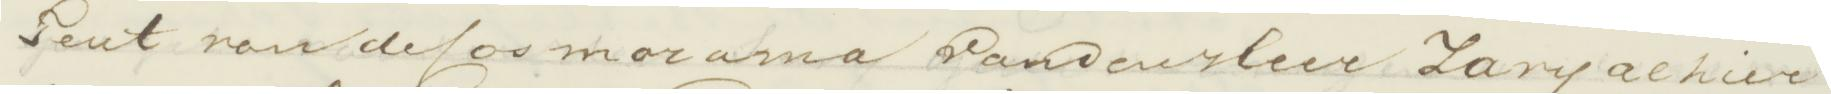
Tent van de Cosmorama van den Heer Zary alhier
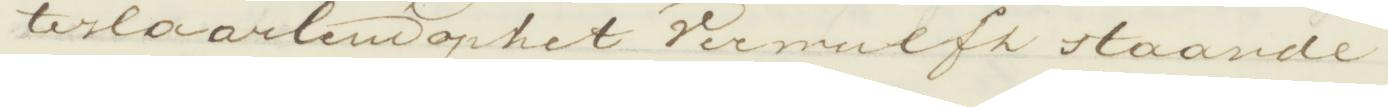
te Haarlem op het Verwulft staande
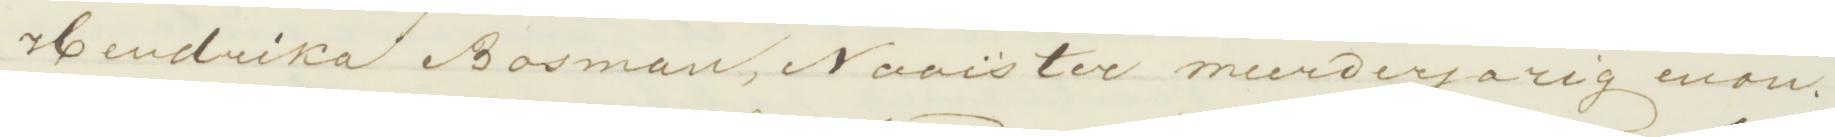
Hendrika Bosman, Naaister meerderjarig en on,
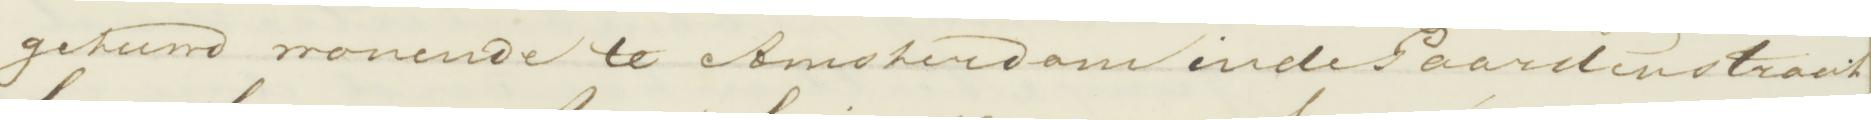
gehuwd wonende te Amsterdam in de Paardenstraat
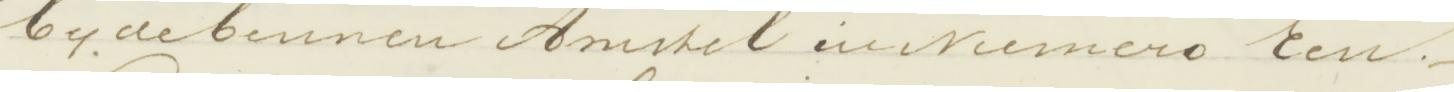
by de binnen Amstel in Numero Een. —
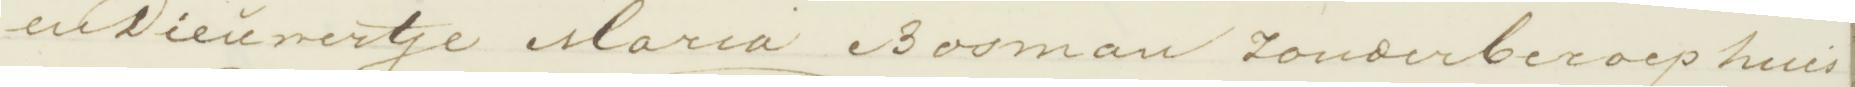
en Dieuwertje Maria Bosman zonder beroep huis
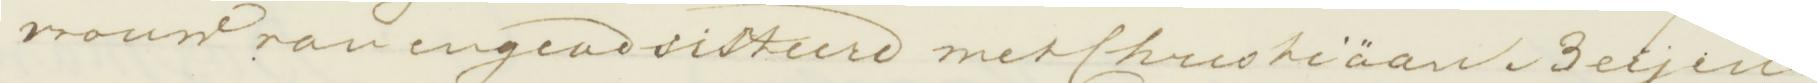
vrouw van en geadsisteerd met Christiaan Beyen
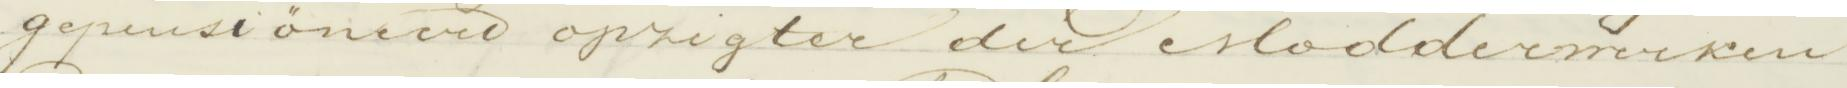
gepensioneerd opzigter der Modderwerken
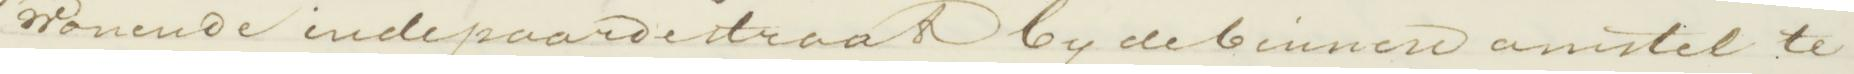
Wonende inde paardestraat by de binnen amstel te
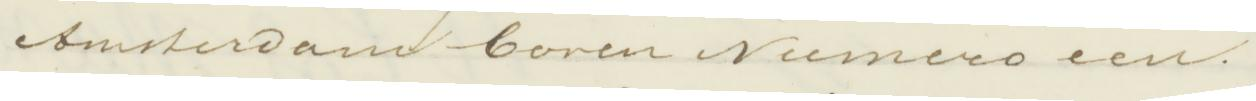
Amsterdam boven Numero een.
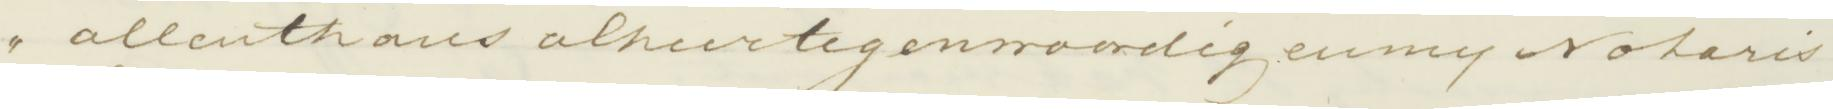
„ allen thans alhier tegenwoordig en my Notaris
